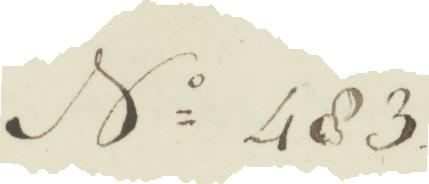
N=o 483
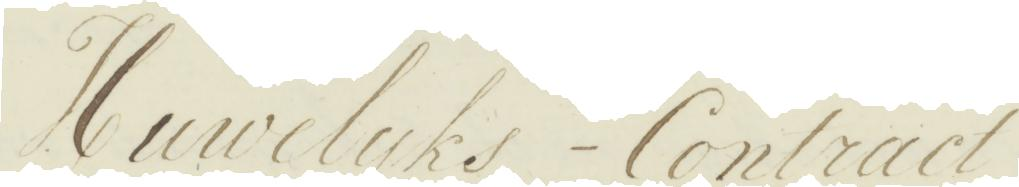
Huwelijks-Contract
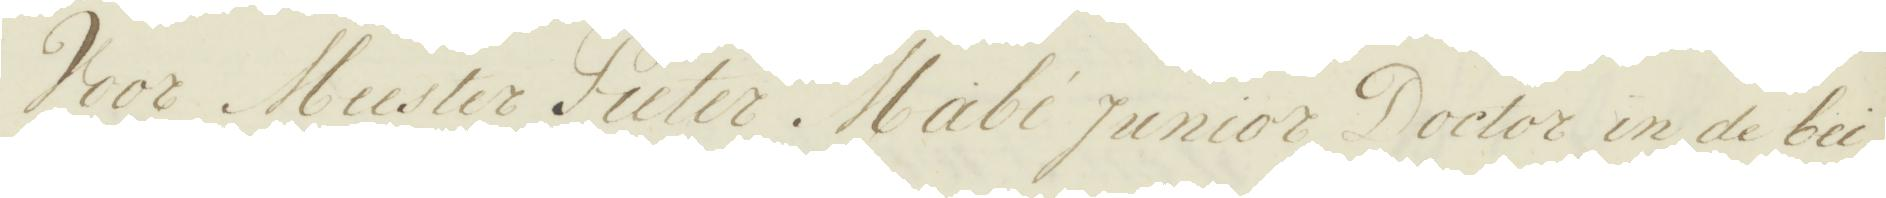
Voor Meester Pieter Mabé Junior, Doctor in de bei
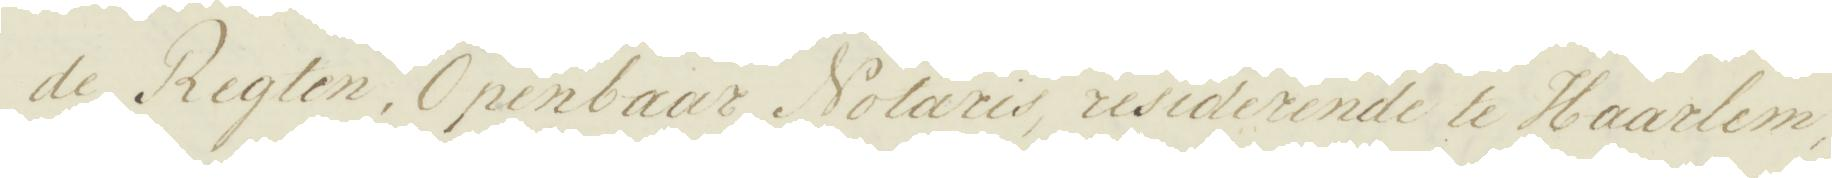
de Regten, Openbaar Notaris, residerende te Haarlem
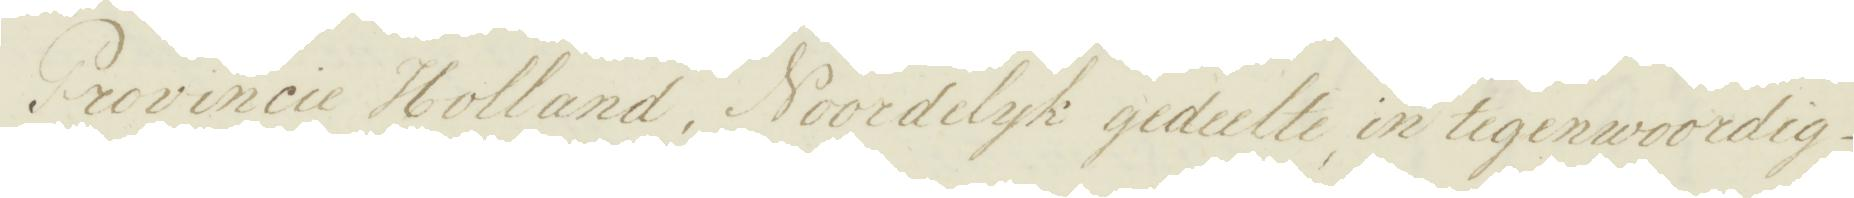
Provincie Holland, Noordelyk gedeelte, in tegenwoordig
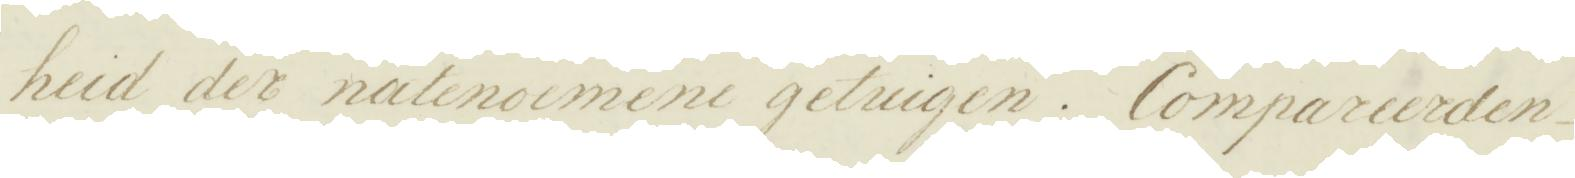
heid der natenoemene getuigen. Compareerden
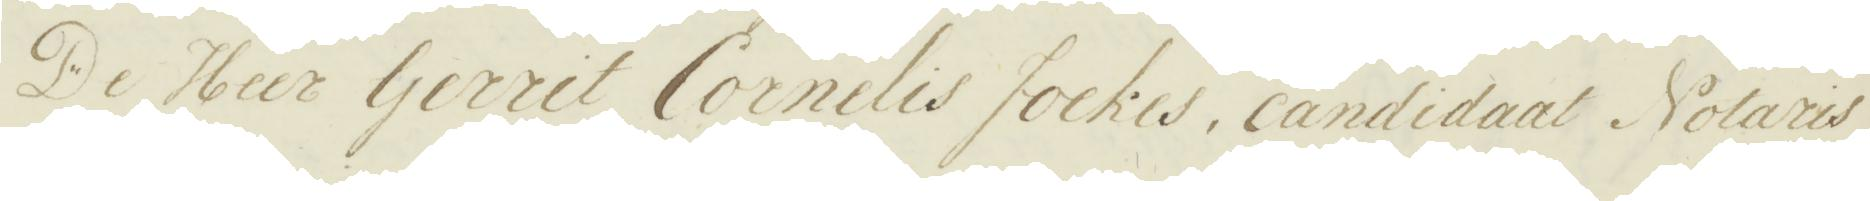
De Heer Gerrit Cornelis Joekes, candidaat Notaris
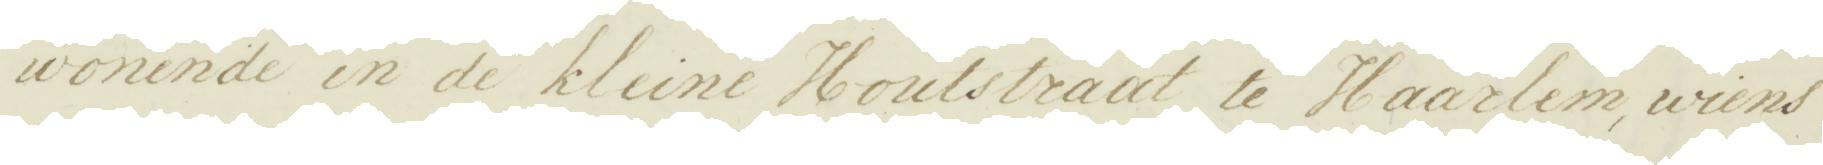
wonende in de kleine Houtstraat te Haarlem, wiens
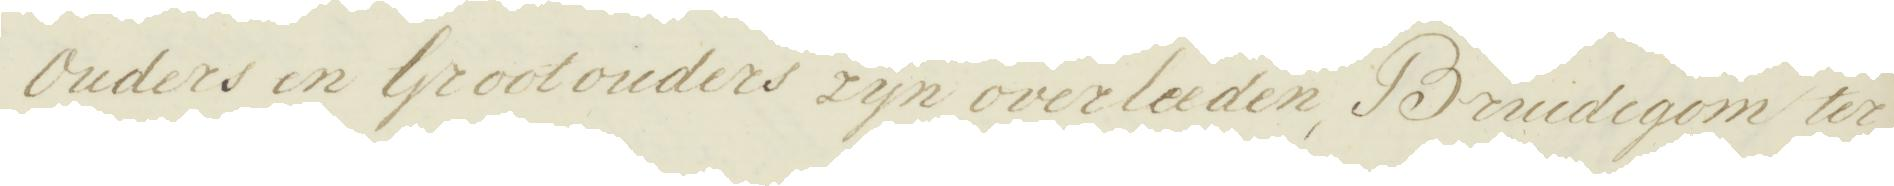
Ouders en Grootouders zijn overleeden, Bruidegom ter
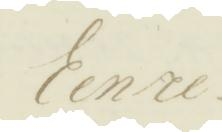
Eenre
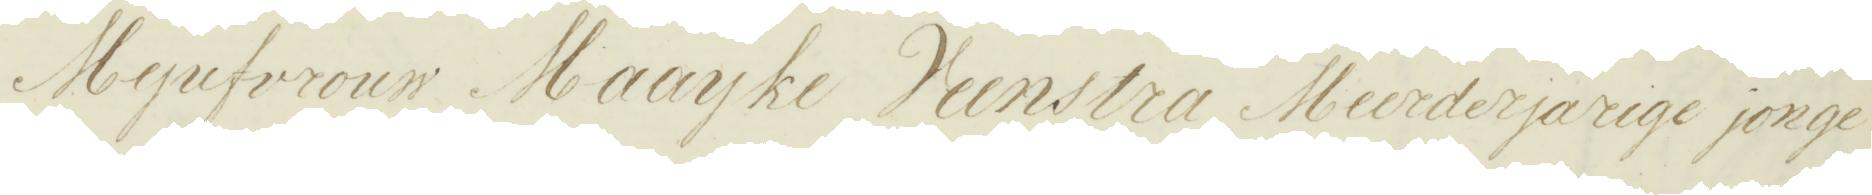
Mejufvrouw Maayke Veenstra, Meerderjarige jonge
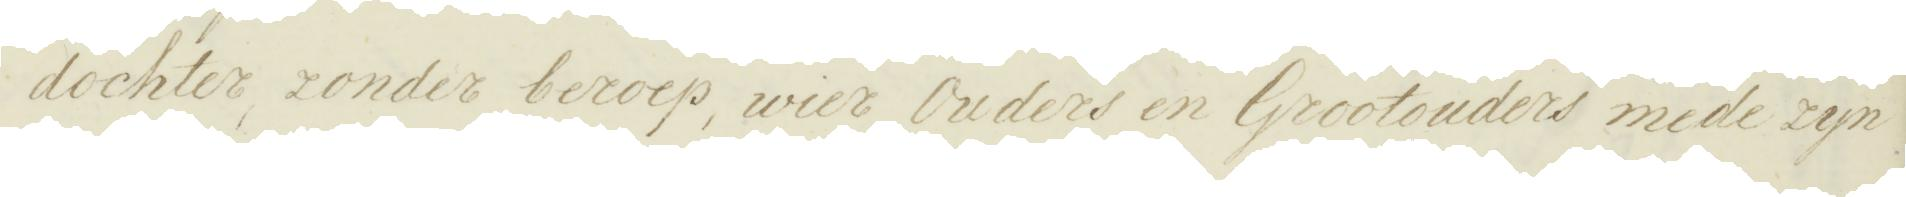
dochter, zonder beroep, wier Ouders en Grootouders mede zyn
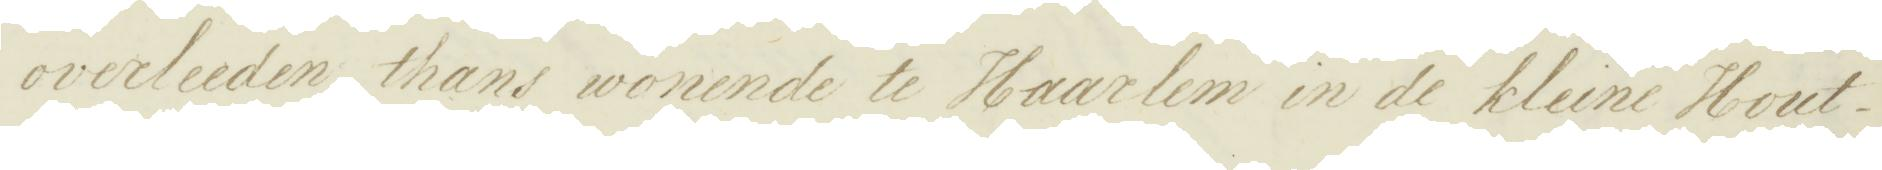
overleeden, thans wonende te Haarlem in de kleine Hout=
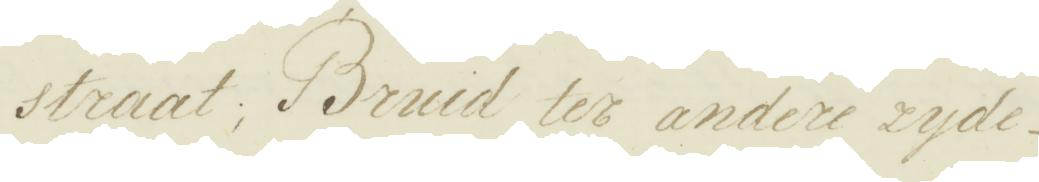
straat, Bruid ter andere zyde.
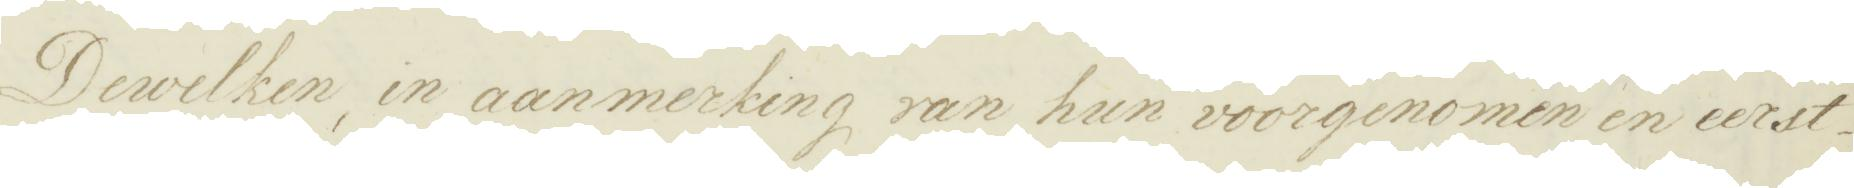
Dewelken, in aanmerking van hun voorgenomen en eerst
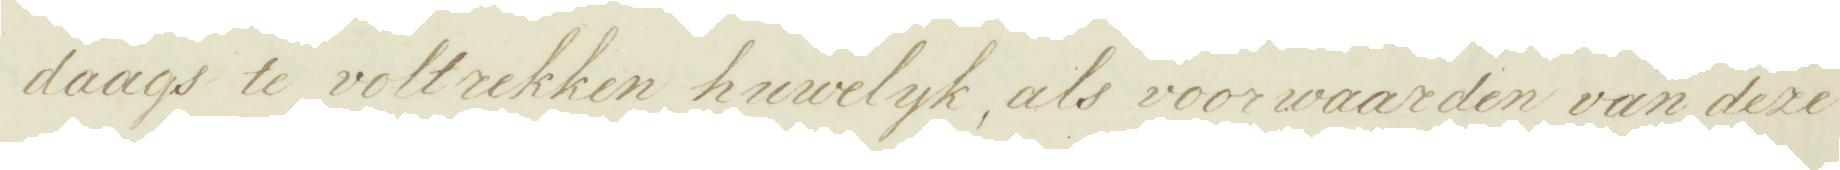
daags te voltrekken huwelyk, als voorwaarden van deze
